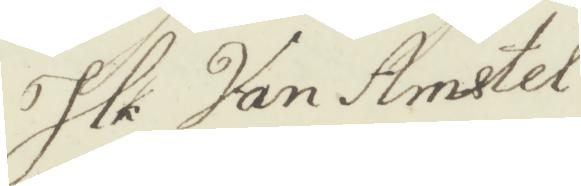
Jlk Van Amstel
